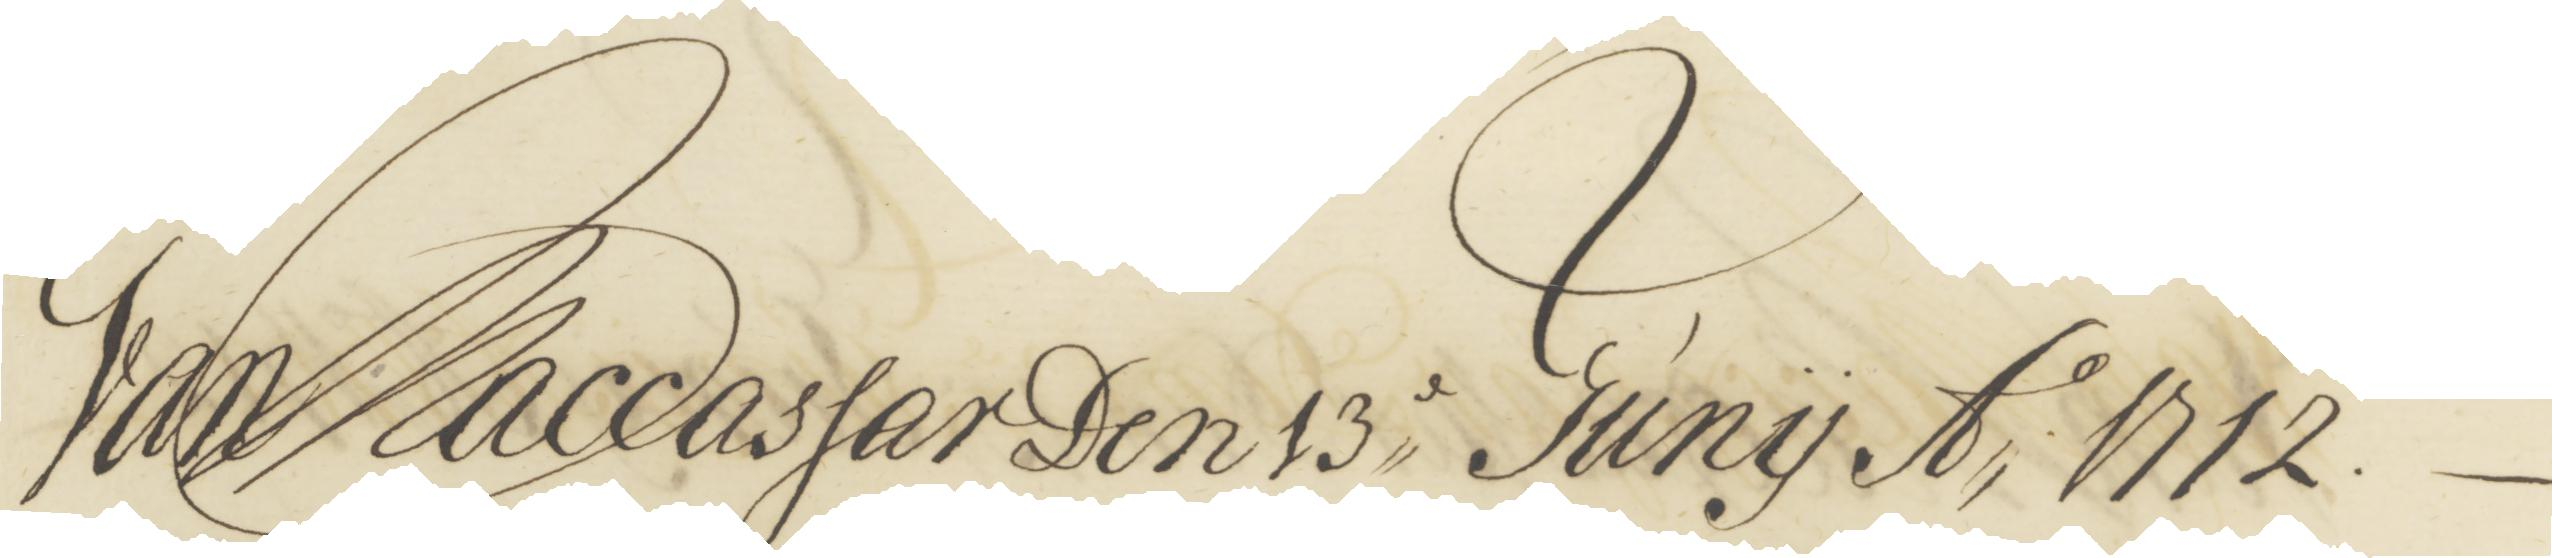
Van Maccassar Den 13„e Iunij A„o 1712. —
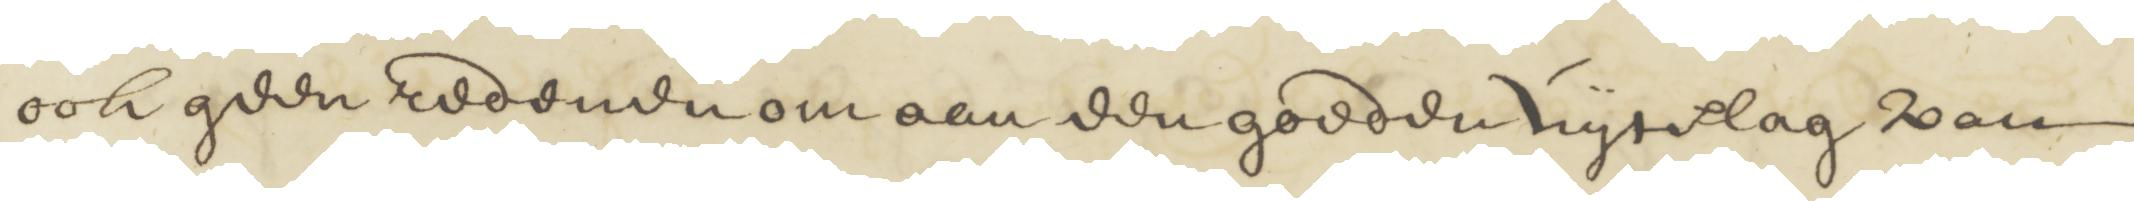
ook geen redenen om aan een goeden uijtslag van
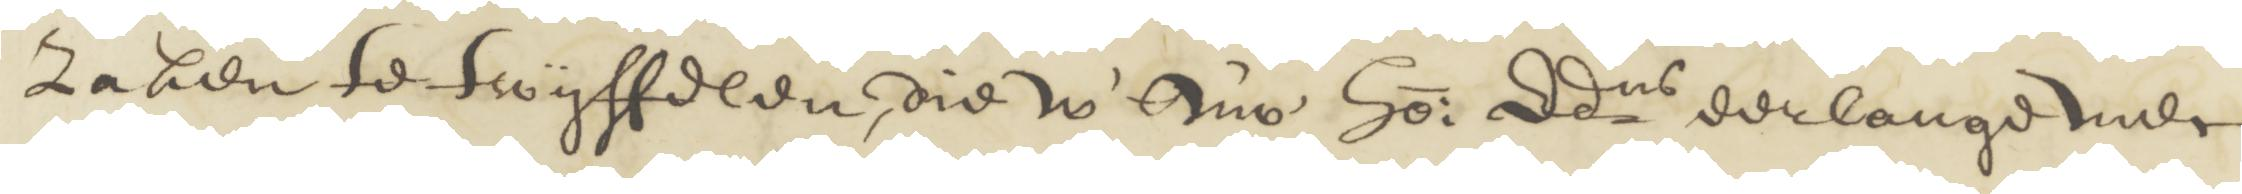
zaken te twijffelen, die w' uw ho: Ed=ns eerlange met
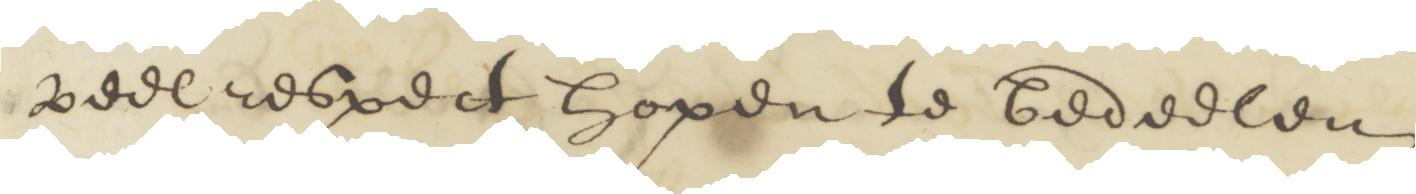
veel respect hopen te bedeelen
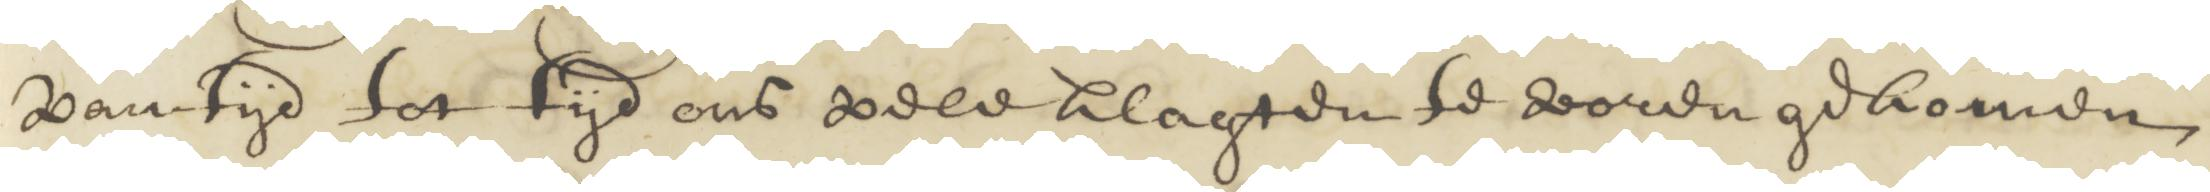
van tijd tot tijd ons vele klagten te vooren gekomen,
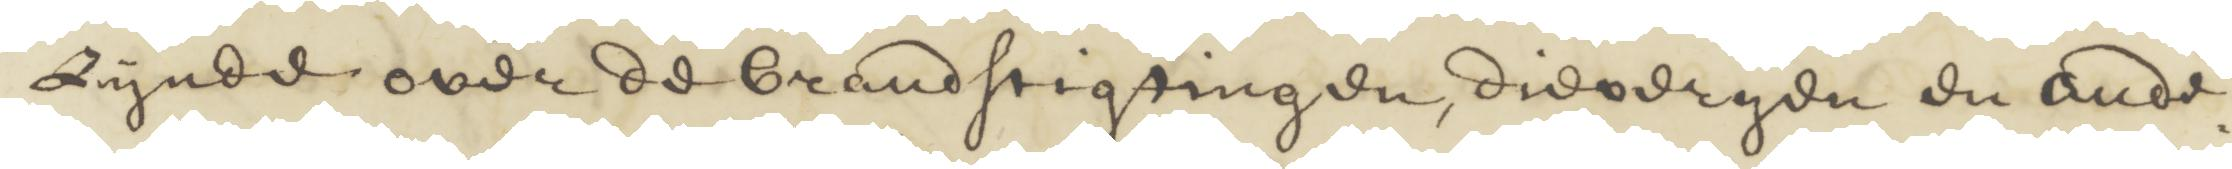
zijnde over de brandstigtingen, dieverijen en ande=
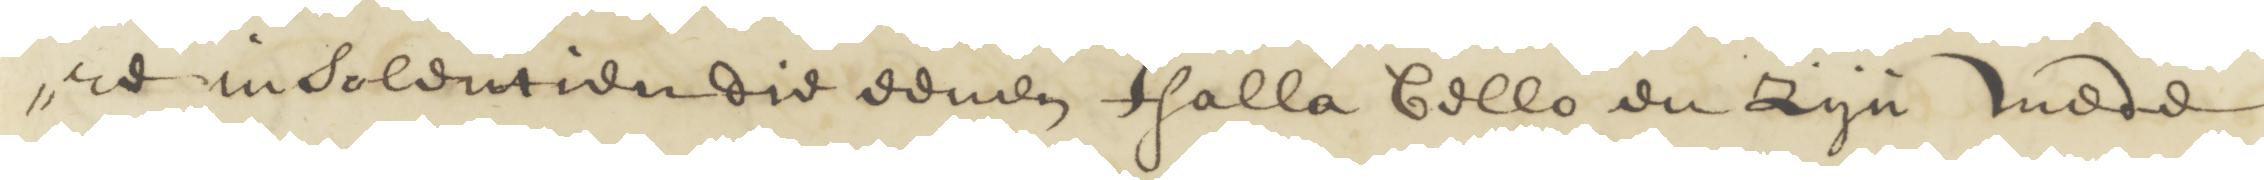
„re insolentien die eenen tsalla bello en zijn mede
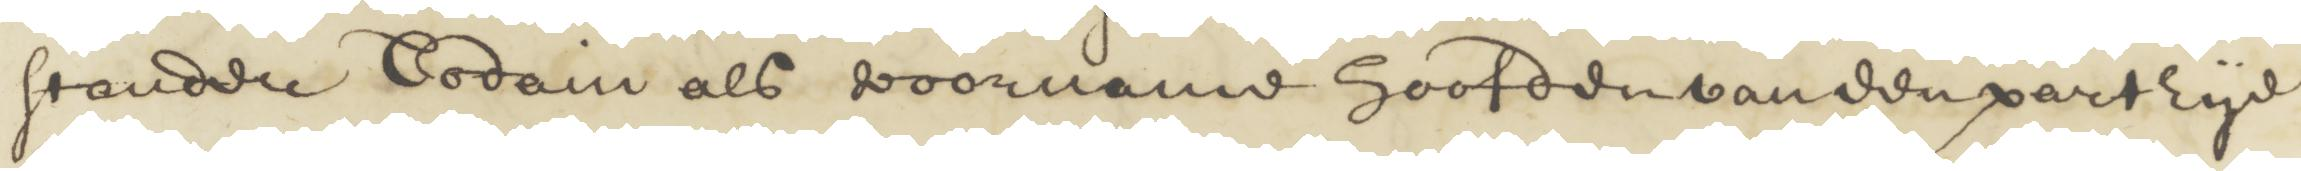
stander Todain als voorname hoofden van een parthije
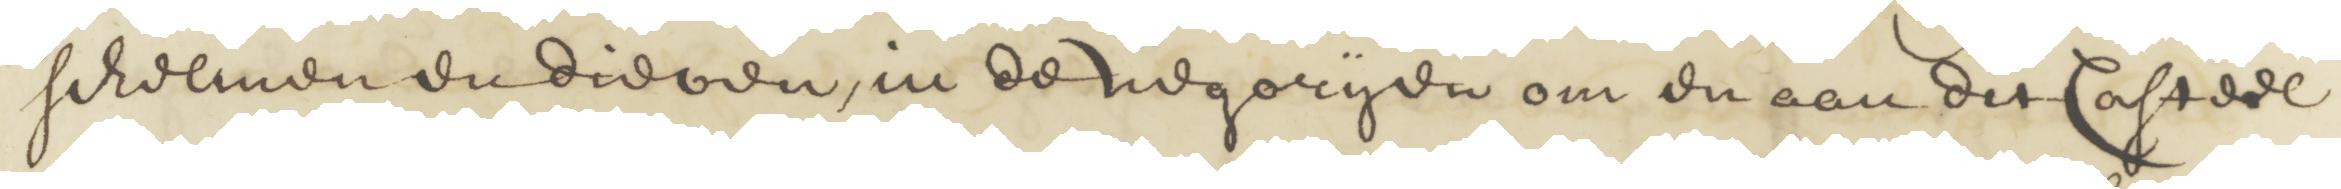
schelmen en dieven, in de negorijen om en aan dit Casteel
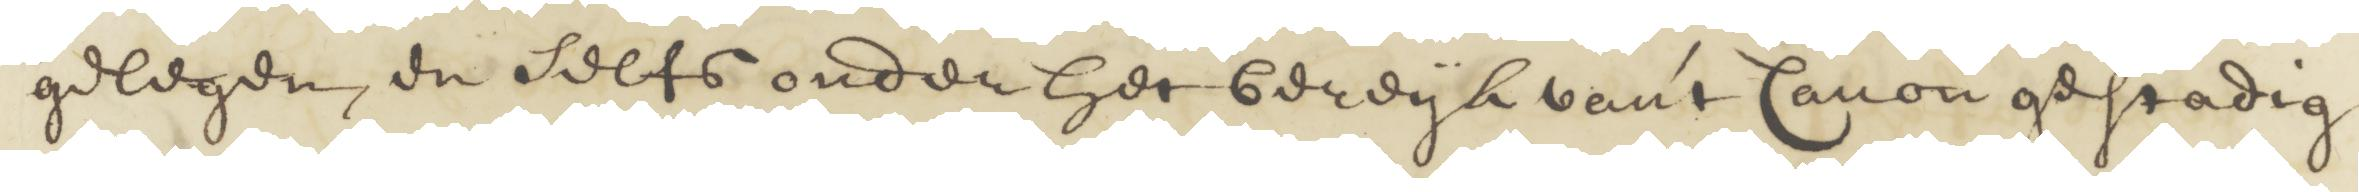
gelegen, en selfs onder het bereijk van ’t Canon gestadig
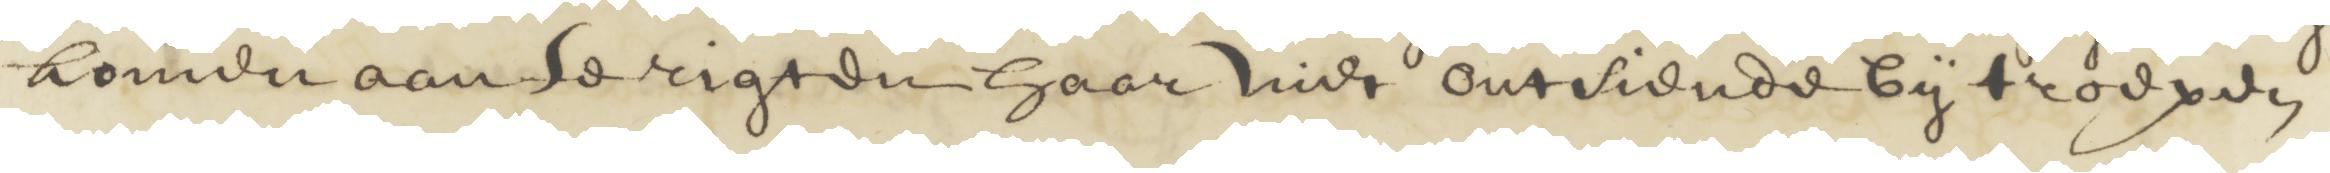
komen aan te rigten haar niet ontsiende bij troepen
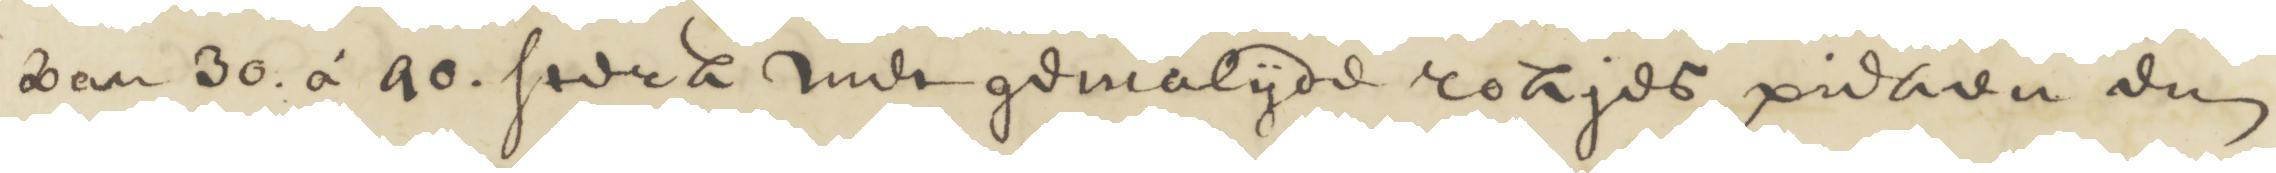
van 30. á 40. sterk met gemalijde rokjes pieken en
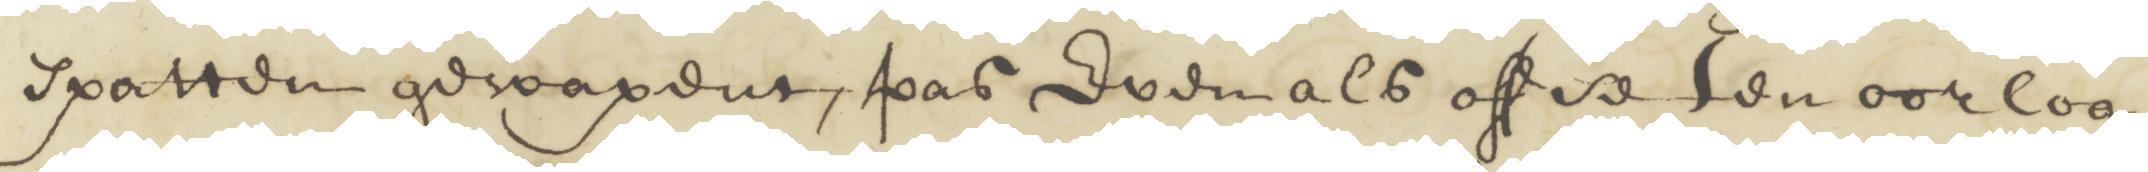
spatten gewapent, pas Even als offse ten oorlog
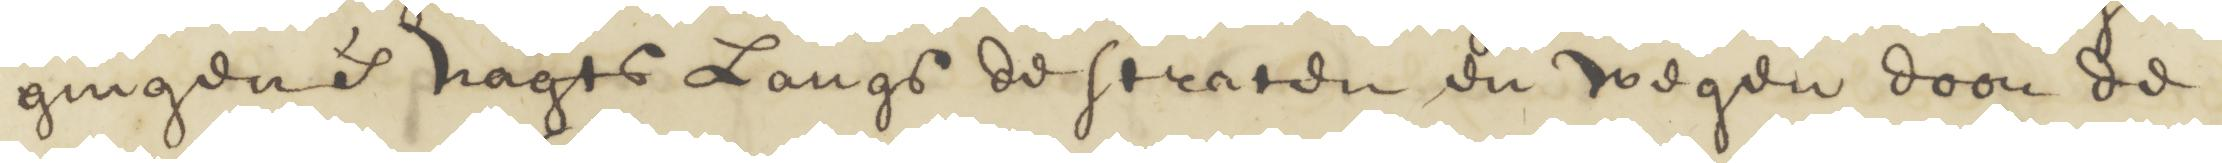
gingen 's nagts Langs de straten en wegen door de
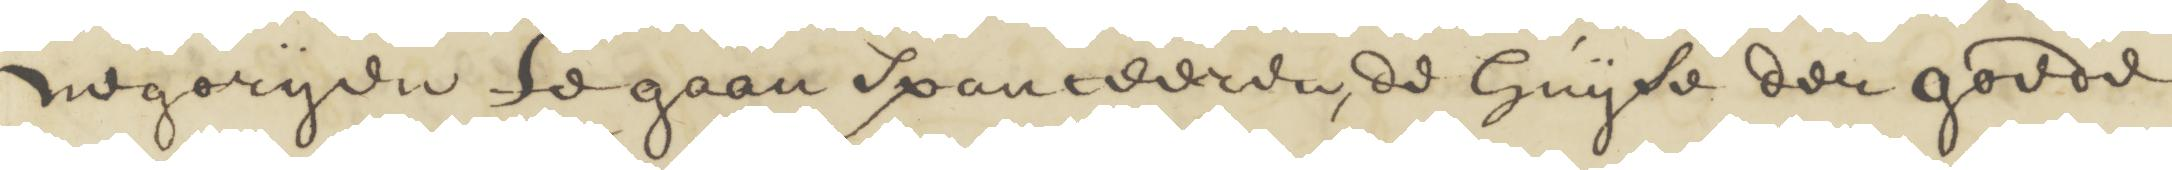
negorijen te gaan spanceeren, de huijse der goede
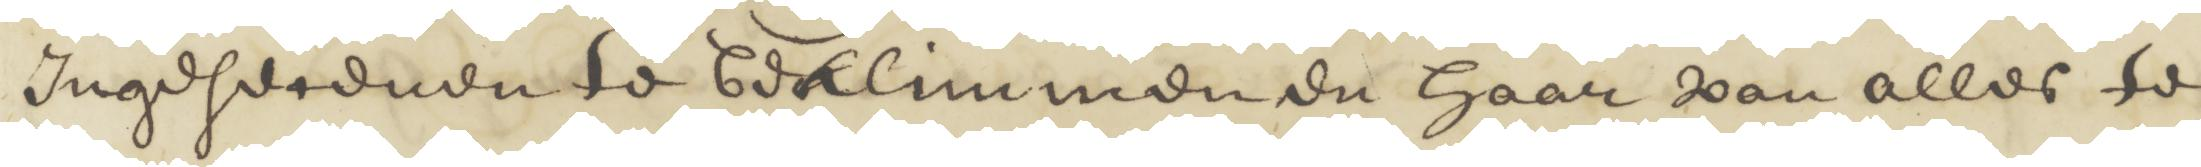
Ingesetenen te beklimmen en haar van alles te
